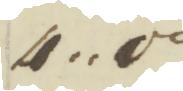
4 „ do
